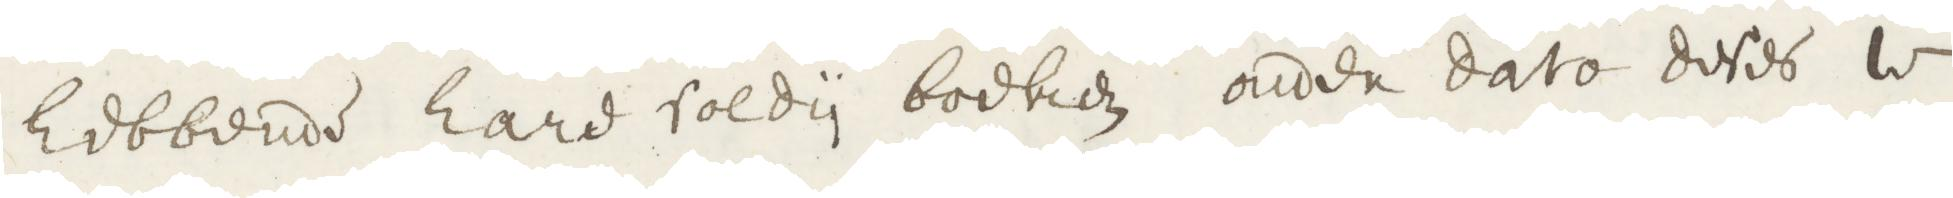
hebbende hare soldij boeken onder dato deses te
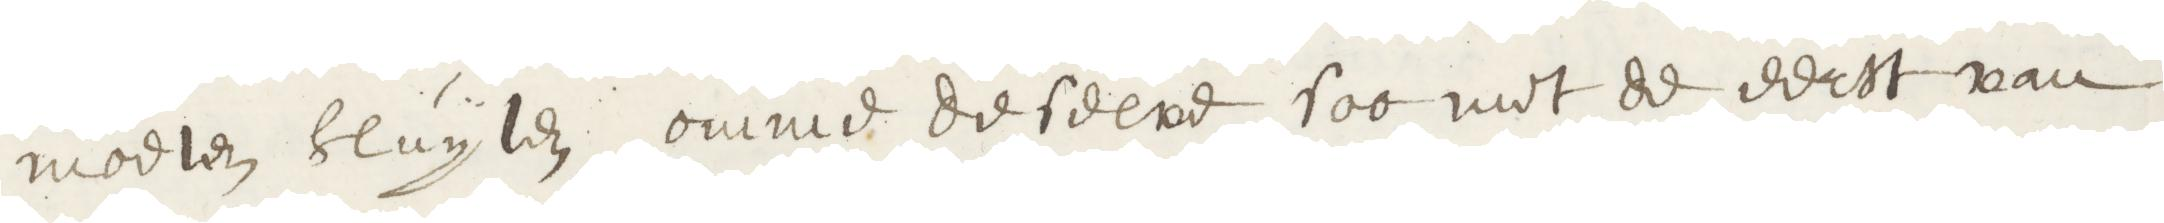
moeten sluijten omme deselve soo met de eerst van
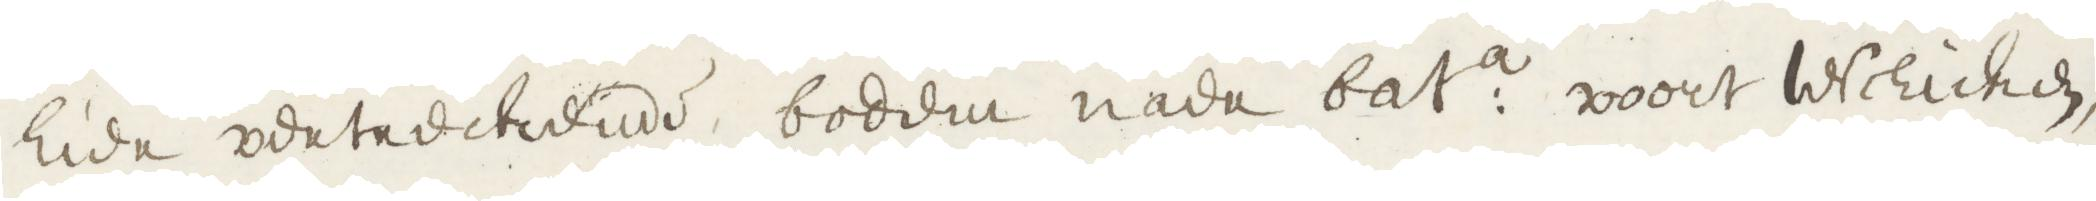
hier vertreckende bodem naer bat:a voort teschicken
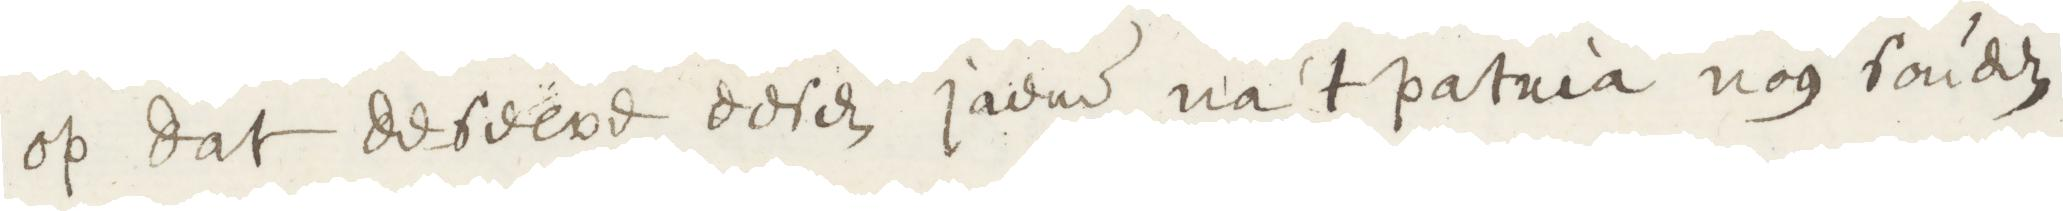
op dat deselve desen jaere na ’t patria nog souden
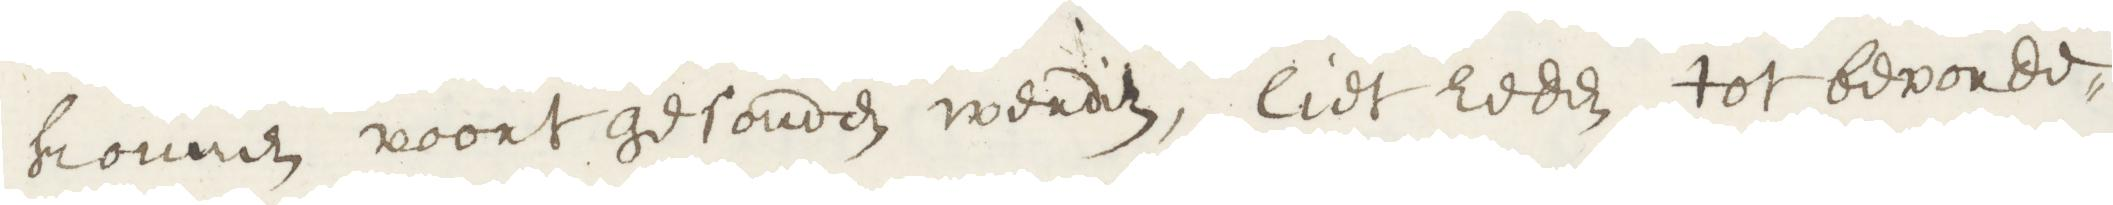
konnen voort gesonden werden, liet heden tot bevorde„
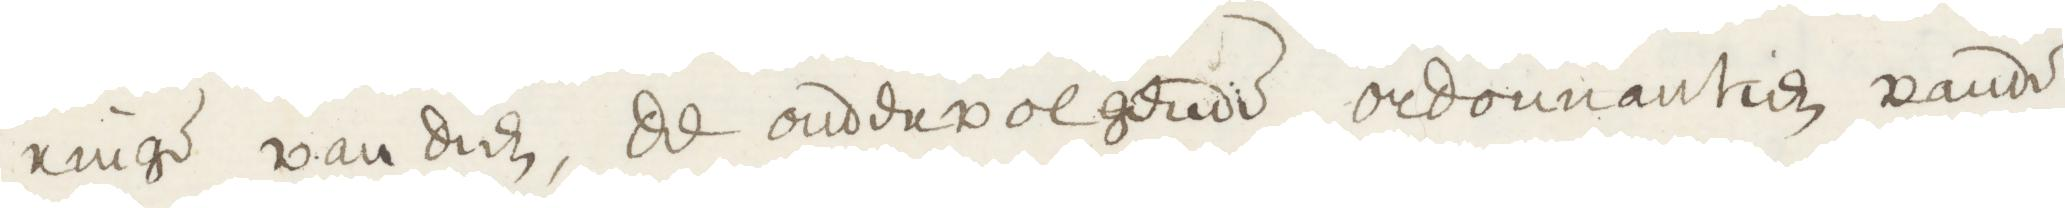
ringe van dien, de ondervolgende ordonnantien vande
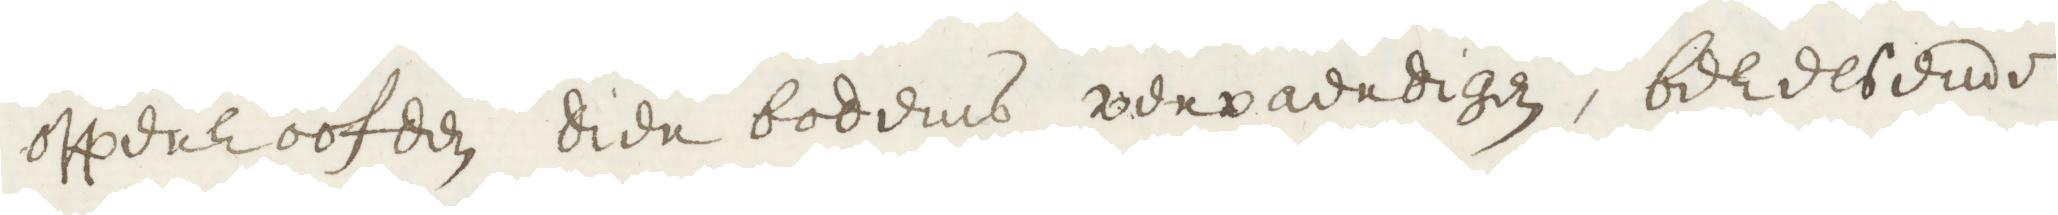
opperhoofden dier bodems vervaerdigen, behelsende
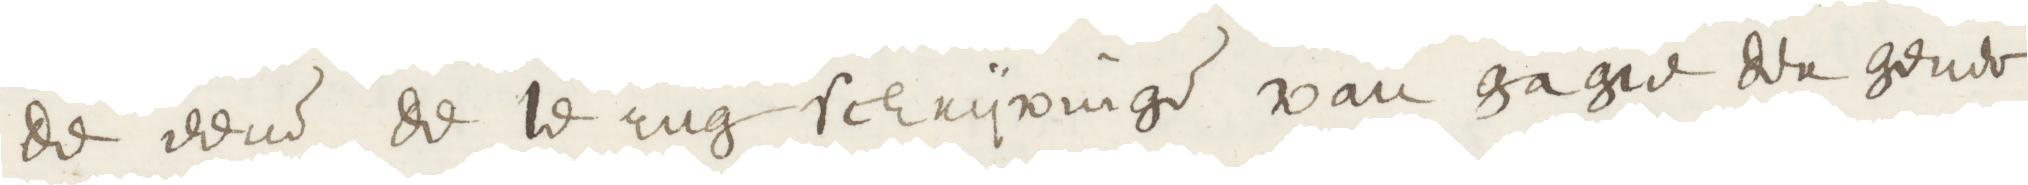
de eene de te rug schrijvinge van gagie der gener
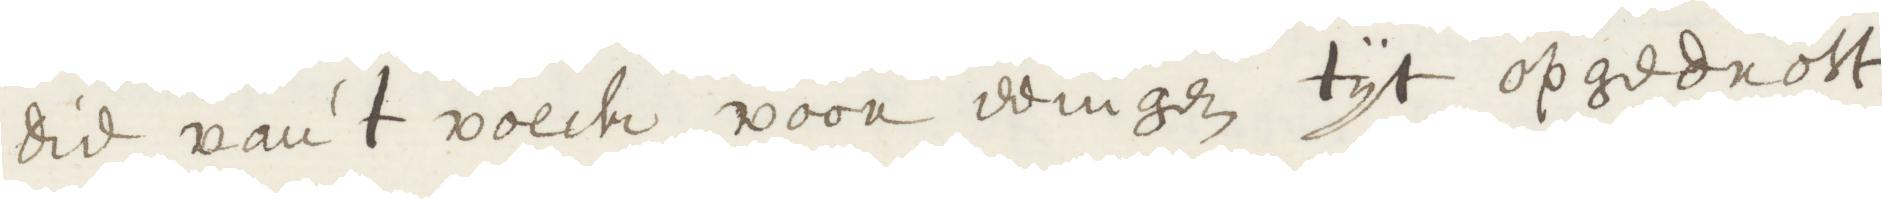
die van ’t volck voor eenigen tijt op gedrost
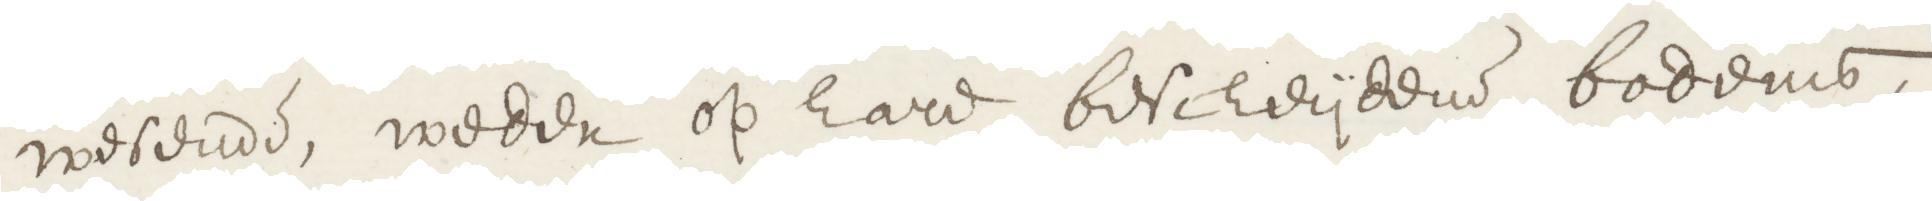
wesende, weder op hare bescheijdene bodems,
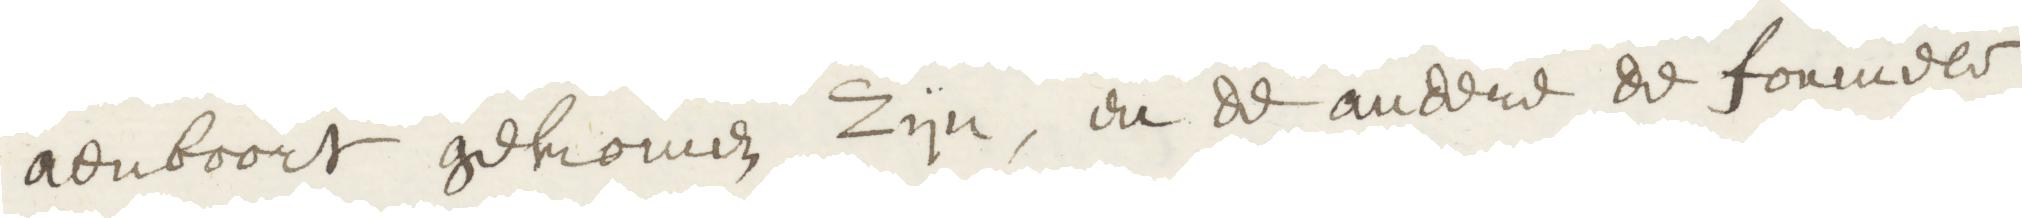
aenboort gekomen zijn, en de andere de formele
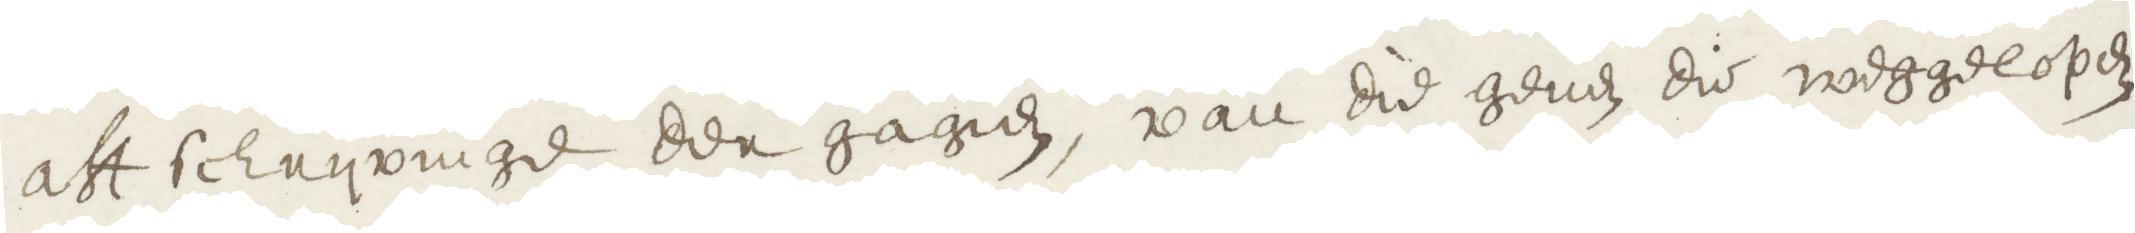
aff schrijvinge der gagien, van die genen die weggelopen
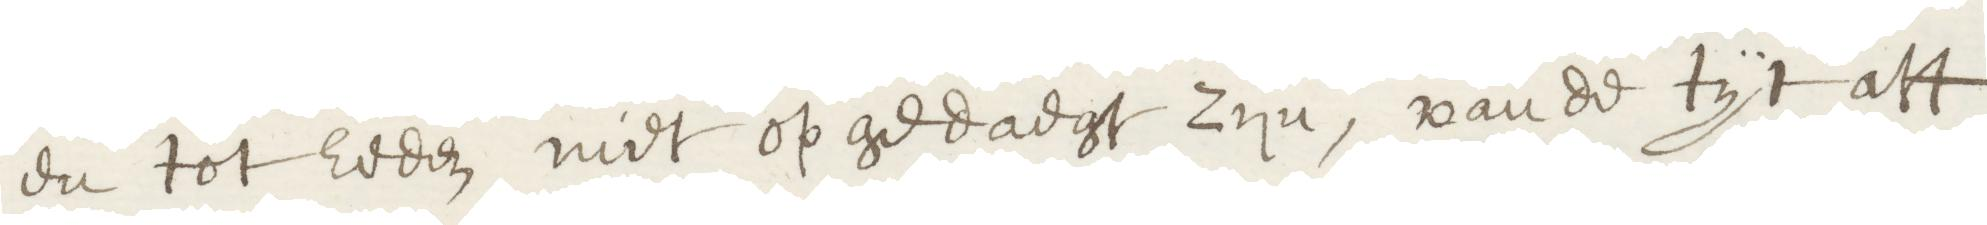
en tot heden niet opgedaegt zijn, van de tijt aff
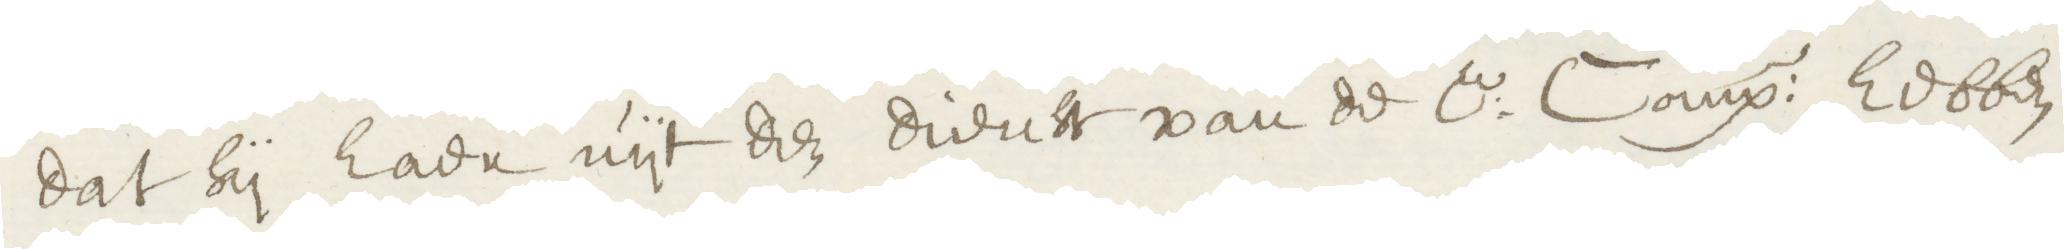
dat sij haer uijt den dienst van de E: Comp: hebben
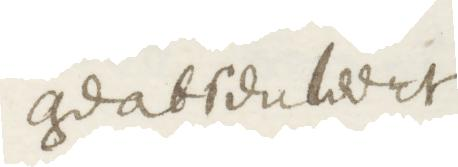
geabsenteert
